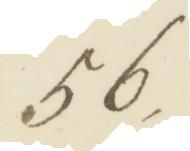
56,
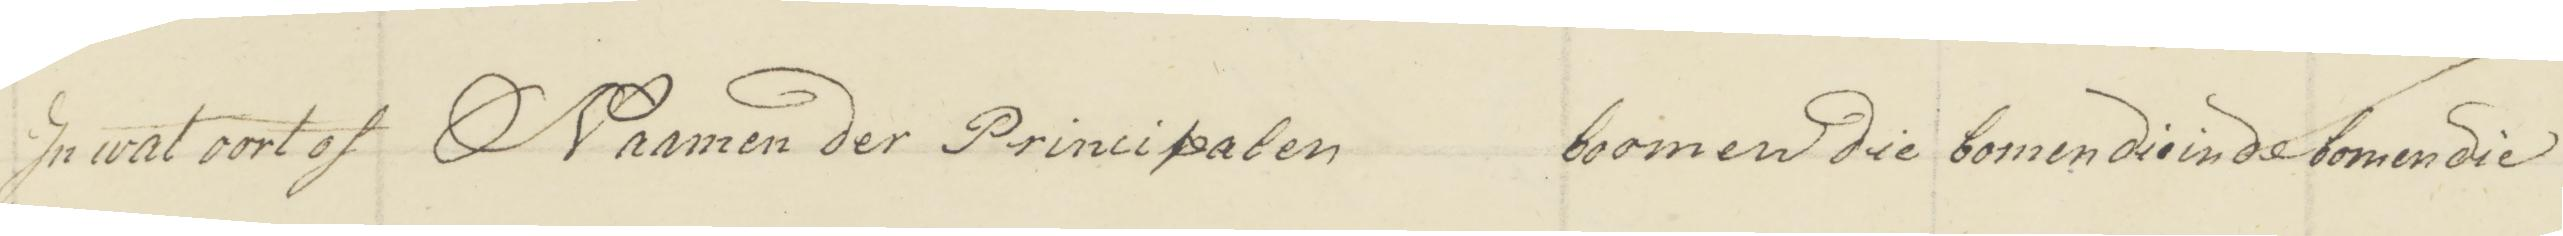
Jn wat oort of Naamen der Principalen boomen die bomen die in de bomen die
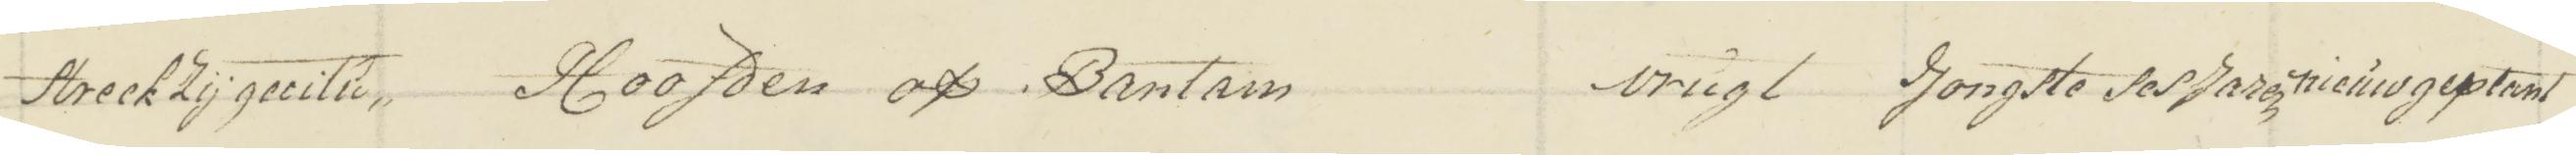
streck Zij gecitu„ Hoofden op Bantam vrugt Jongste ses Jaren nieuw geplant
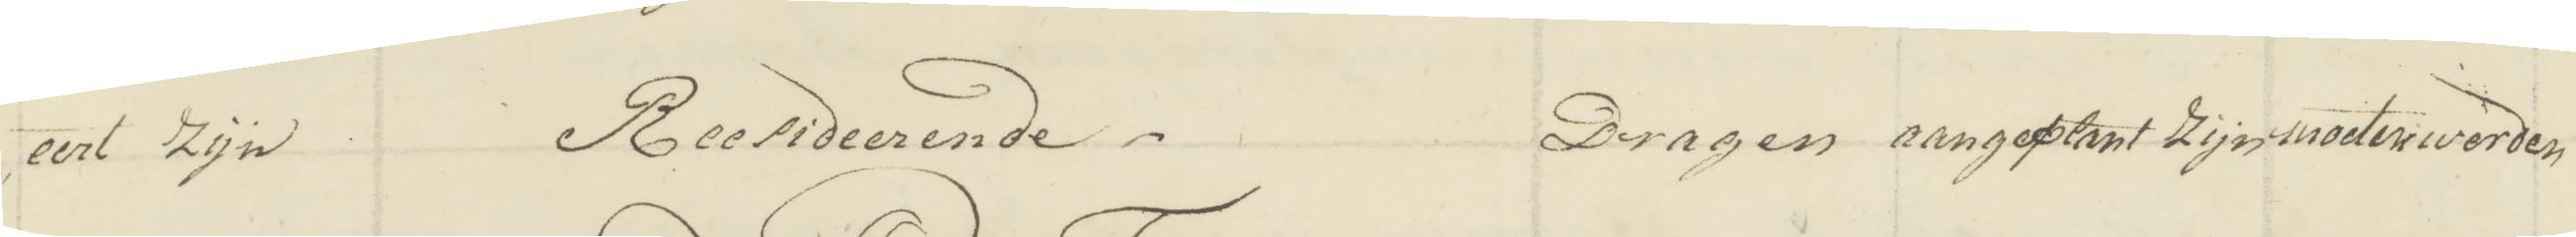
„eert Zijn Reesideerende — Dragen aangeplant Zijn moeten werden
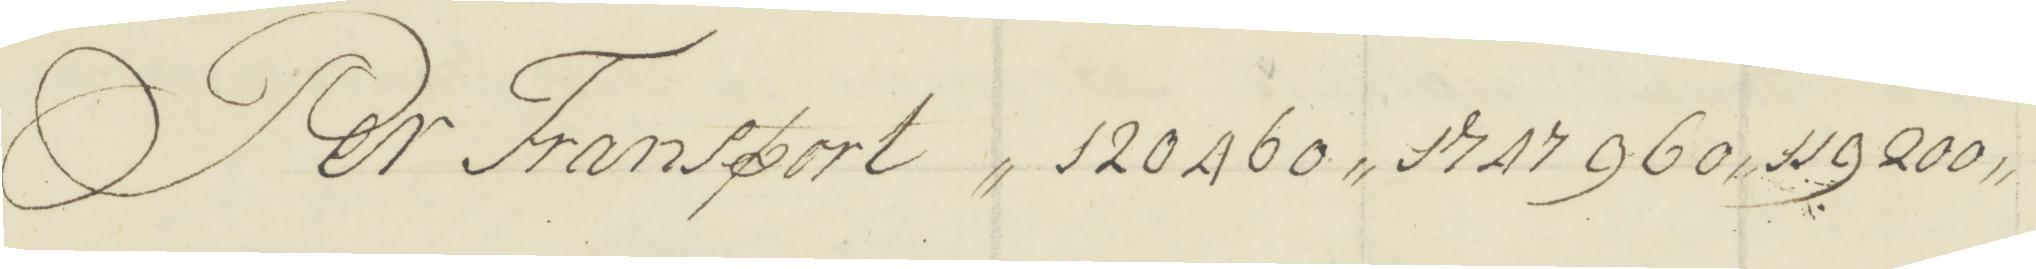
Per Transport „ 120460 „ 1747960 „ 119200 „
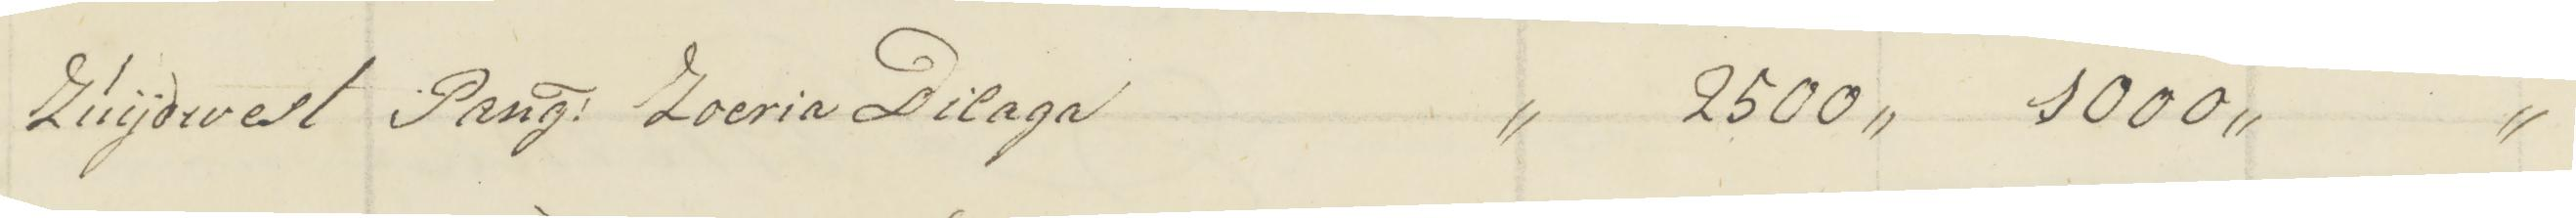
Zuijdwest Pang: Zoeria Dilaga „ 2500 „ 1000 „ „
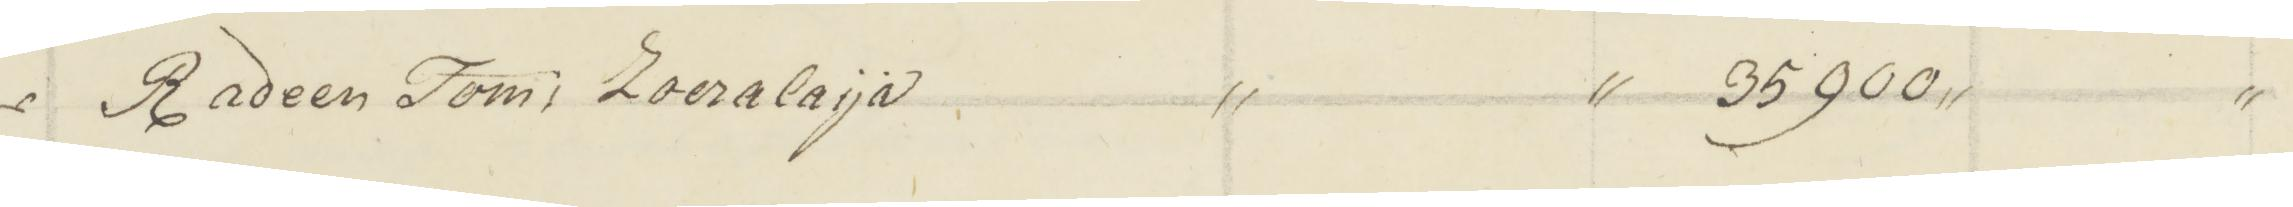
_ Radeen Tom: Zoeralaija „ „ 35900 „ „
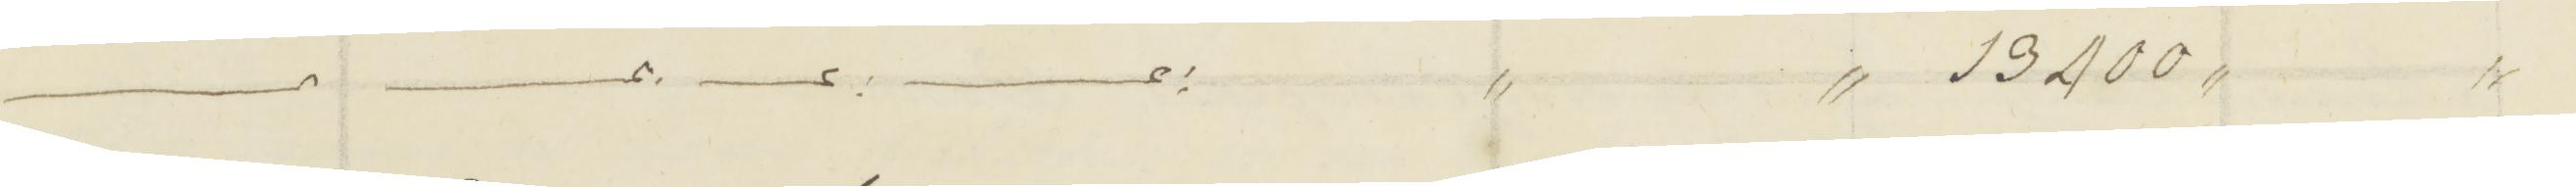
_ _. _: _: „ „ 13400 „ „
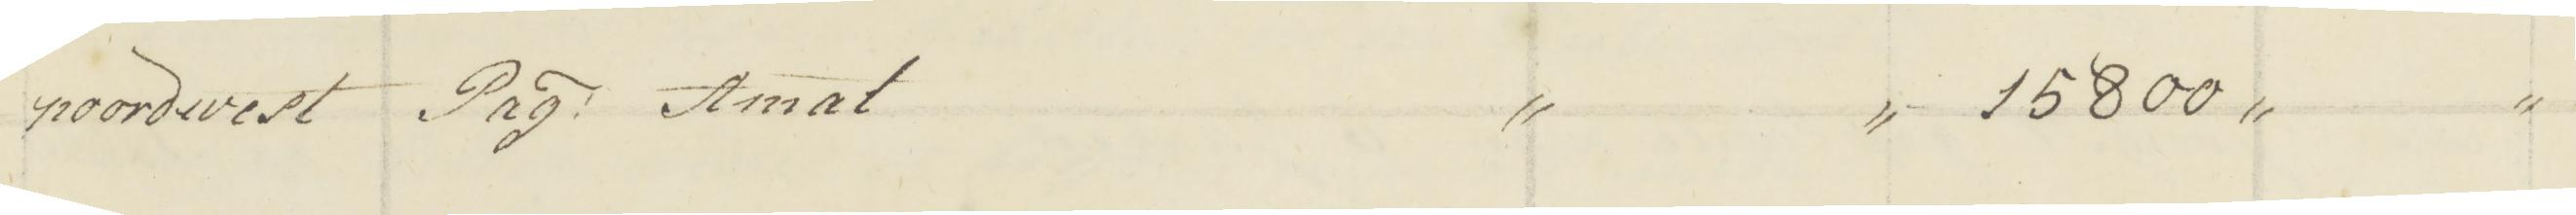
noordwest Pag: Amat „ „ 15800 „ „
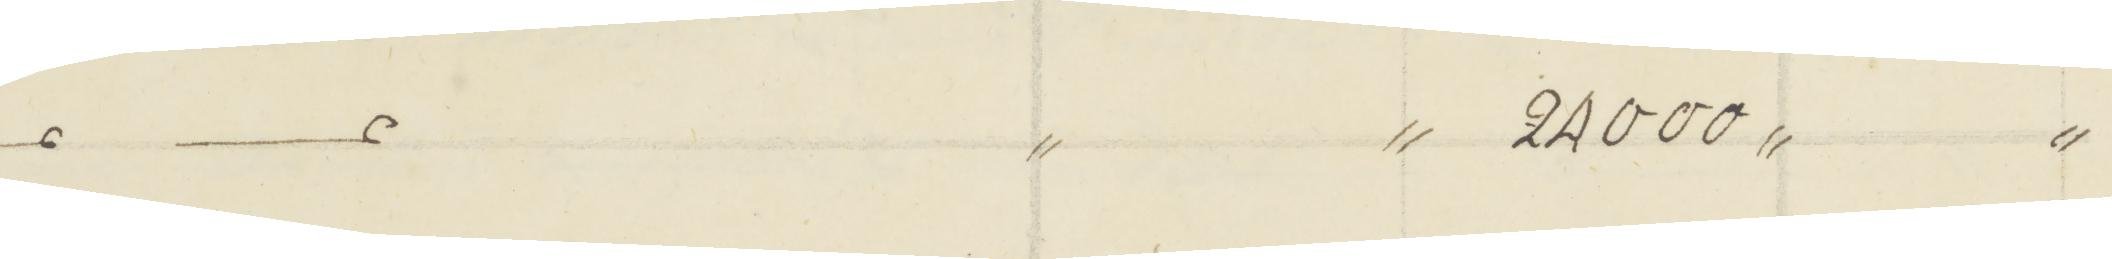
_: _: „ „ 24000 „ „
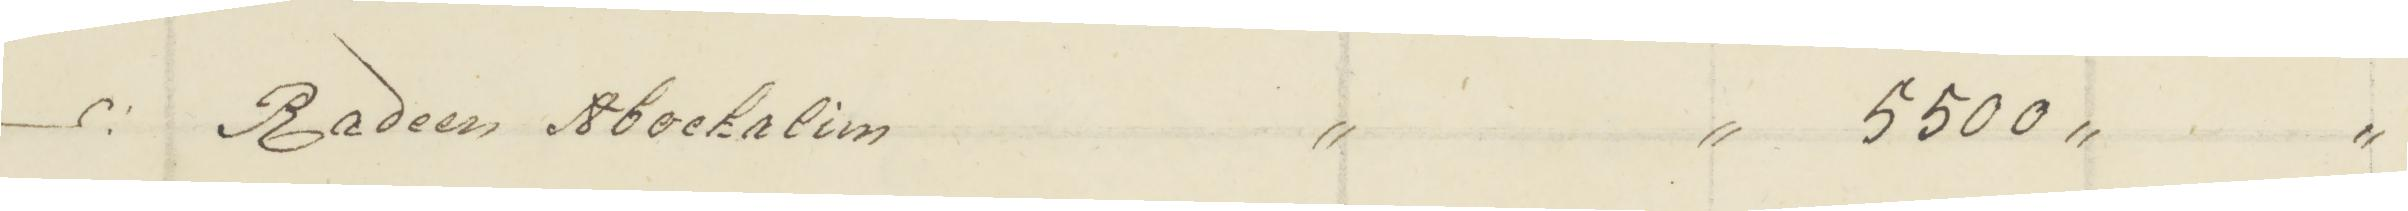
_: Radeen Aboekalim „ „ 5500 „ „
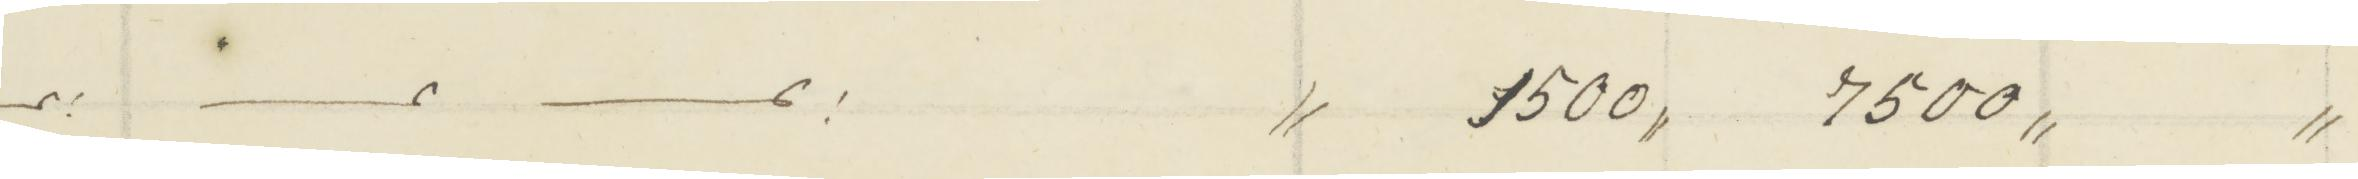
_: _: _: „ 1500 „ 7500 „ „
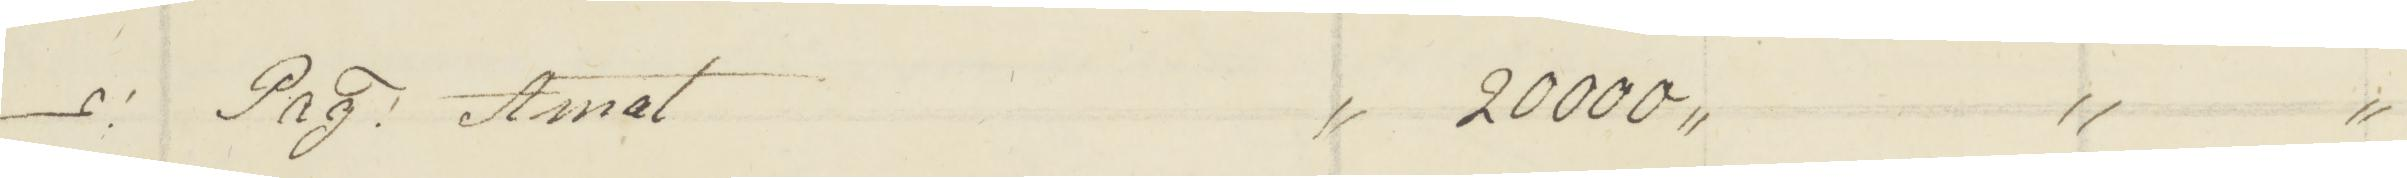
_: Pag: Amat „ 20000 „ „ „
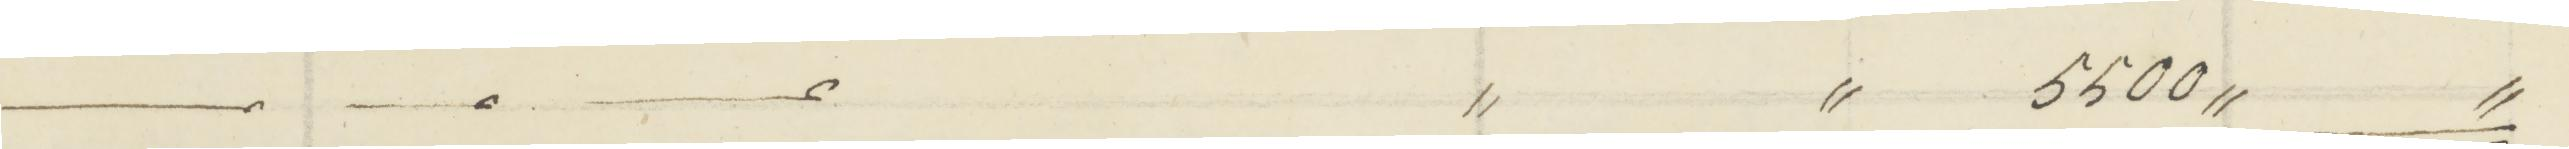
_: _: _: „ „ 5500 „ „
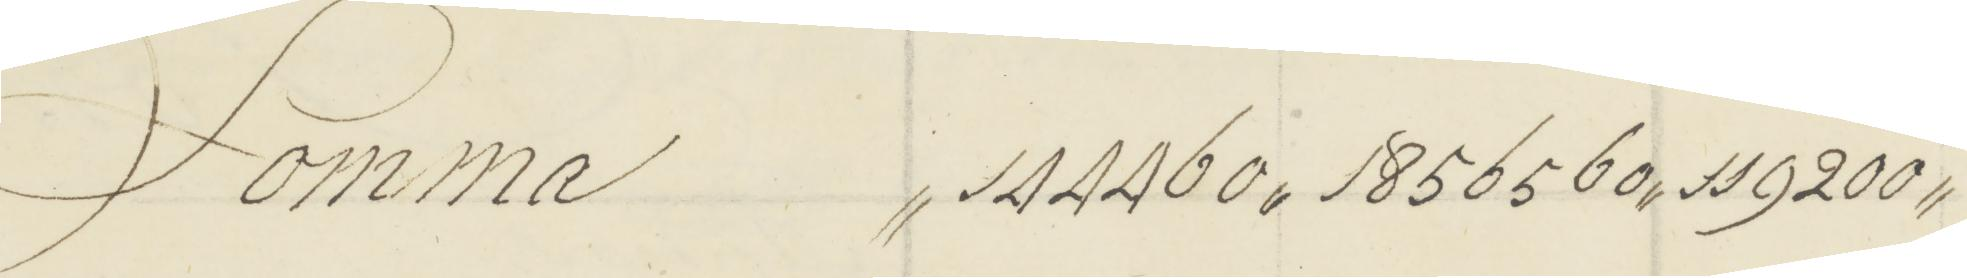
Somma „144460 „ 1856560„ 119200 „
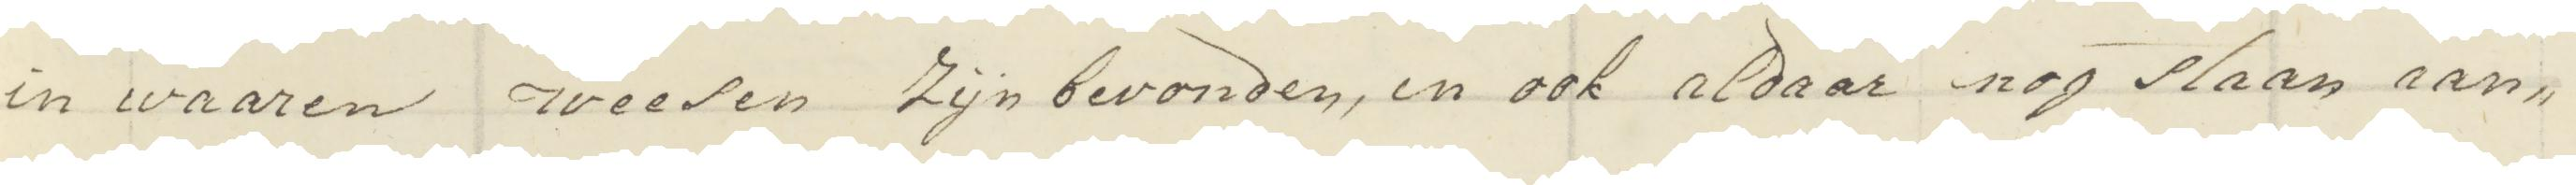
in waaren weesen Zijn bevonden, en ook aldaar nog staan aan„
